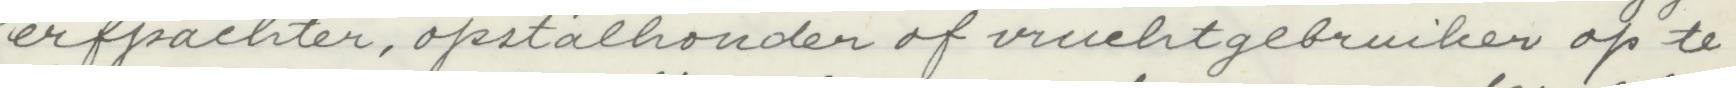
erfpachter, opstalhouder of vruchtgebruiker op te
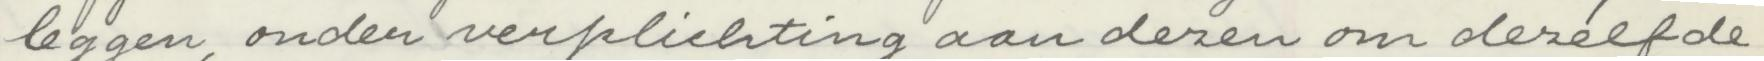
leggen, onder verplichting aan dezen om dezelfde
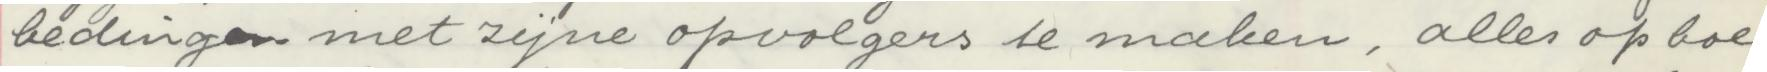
bedingen met zijne opvolgers te maken, alles op boe
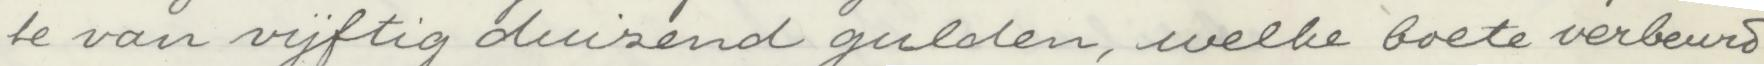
te van vijftig duizend gulden, welke boete verbeurd
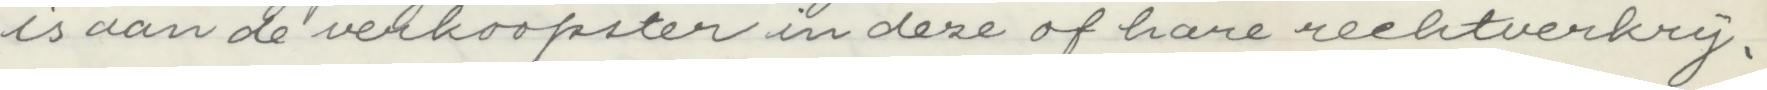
is aan de verkoopster in deze of hare recktverkrij„
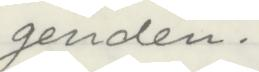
genden.
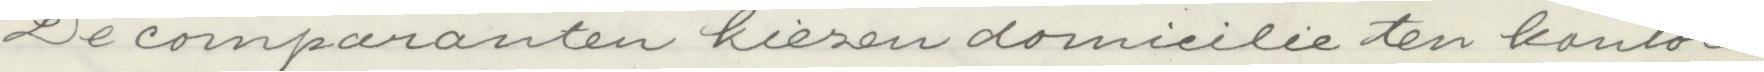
De comparanten kiezen domicilie ten kantore
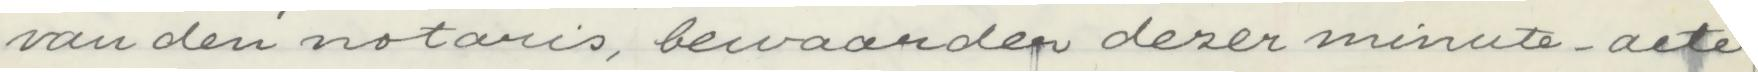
van den notaris, bewaarden dezer minute - acte
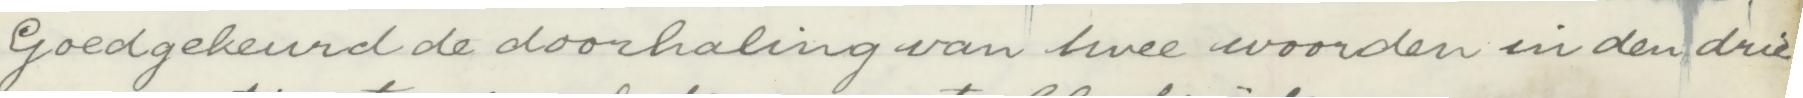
Goedgekeurd de doorhaling van twee woorden in den drie
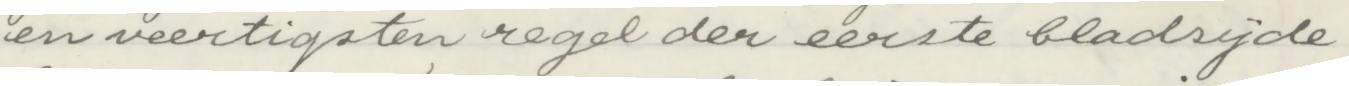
en veertigsten regel der eerste bladzijde
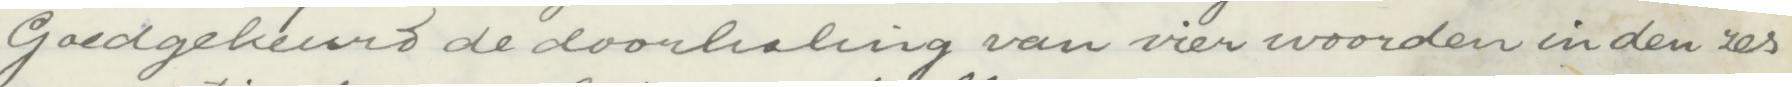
Goedgekeurd de doorhaling van vier woorden in den zes
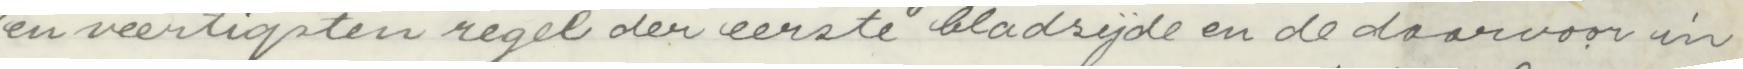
en veertigsten regel der eerste bladzijde en de daarvoor in
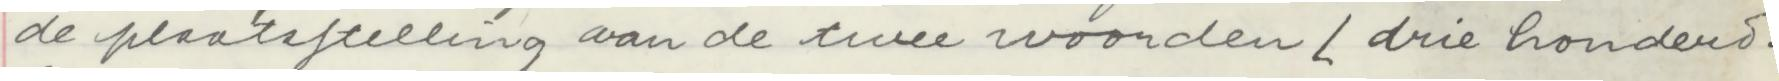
de plaatsstelling van de twee woorden / drie honderd.
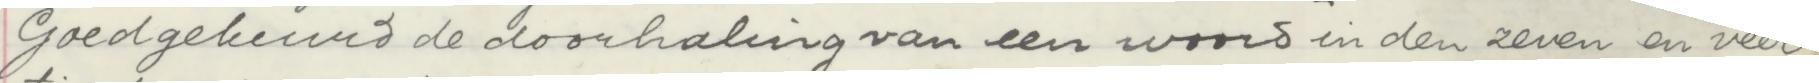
goedgekeurd de doorhaling van een woord in den zeven en veer-
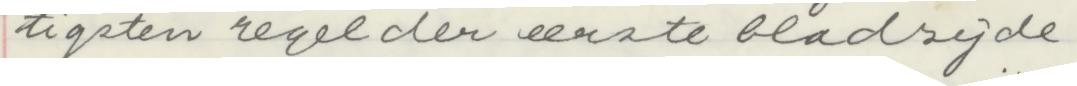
tigsten regel der eerste bladzijde
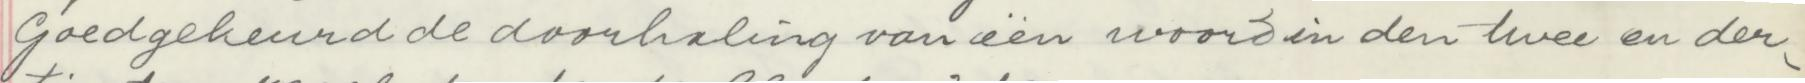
Goedgekeurd de doorhaling van één woord in den twee en der
